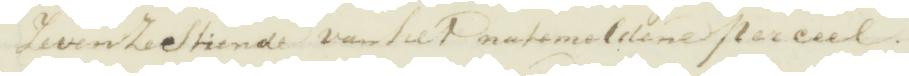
ZevenZestiende van het natemeldene perceel.
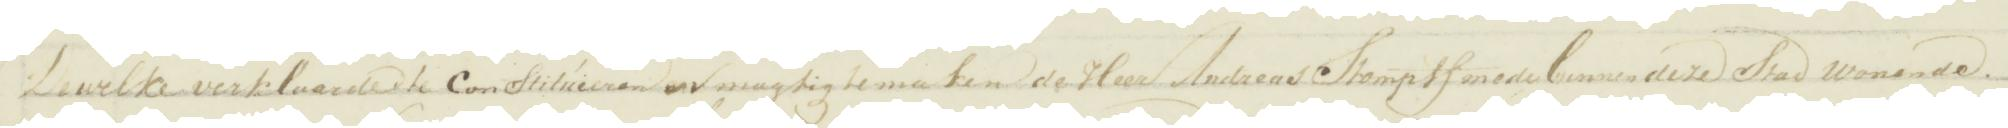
Dewelke verklaarde te Constitueeren en magtig te maken de Heer Andreas Stompff mede binnen deze Stad wonende.
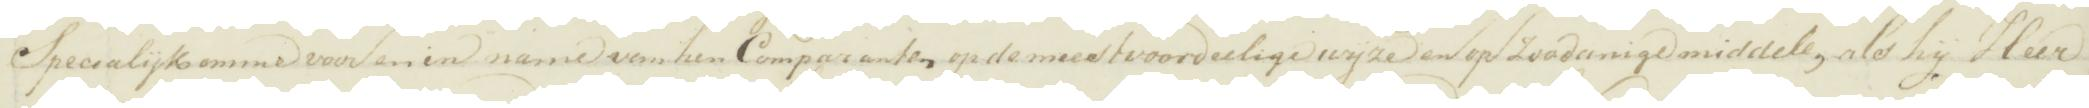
Specialijk omme voor en in name van hen Comparanten op de meest voordeelige wijze en op zoodanige middelen als hij Heer
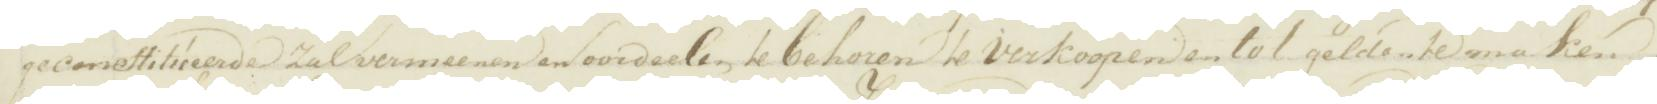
geconstitueerde zal vermeenen en oordeelen te behoren te verkoopen en tot gelden te maken.
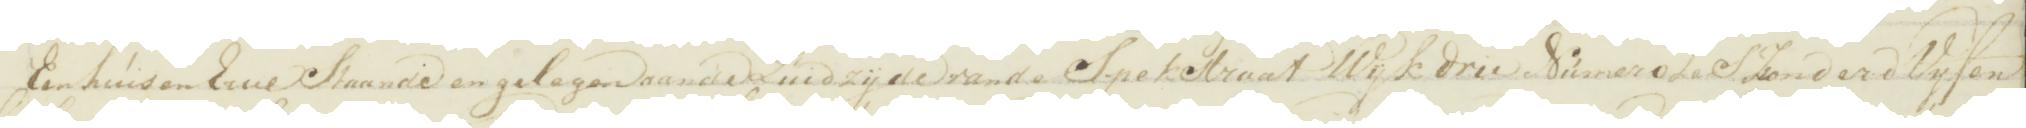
Een huis en Erve Staande en gelegen aan de Zuidzijde van de Spekstraat Wijk drie Numero Zes Honderd Vijfen
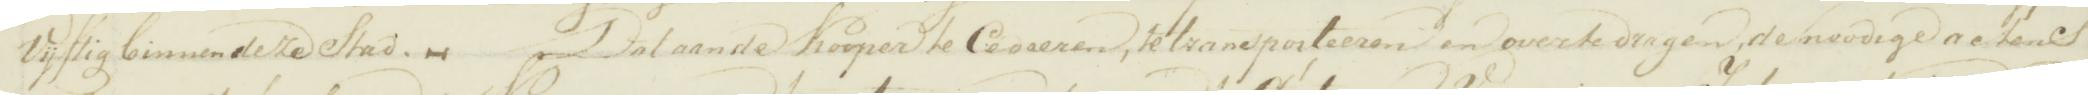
Vijftig binnen deze Stad. Dat aan de Kooper te Cedeeren, te transporteeren en overte dragen, de noodige actens
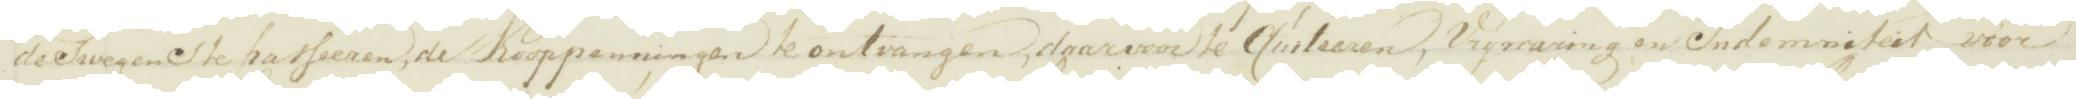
deswegens te passeeren, de Kooppenningen te ontvangen, daarvoor te Quiteeren, Vrywaring en Indemniteit voor
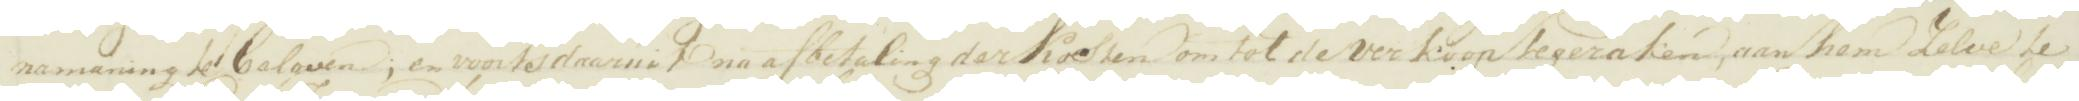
namaning te beloven; en voorts daaruit na afbetaling der Kosten om tot de verkoop te geraken, aan hem Zelve te
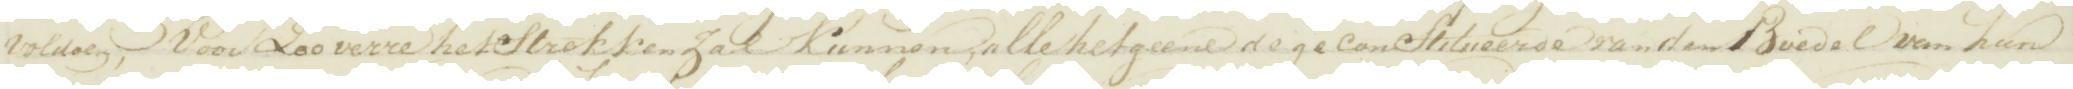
voldoen Voor Zoo verre het strekken zal Kunnen, alle hetgeene de geconstitueerde van den Boedel van hun
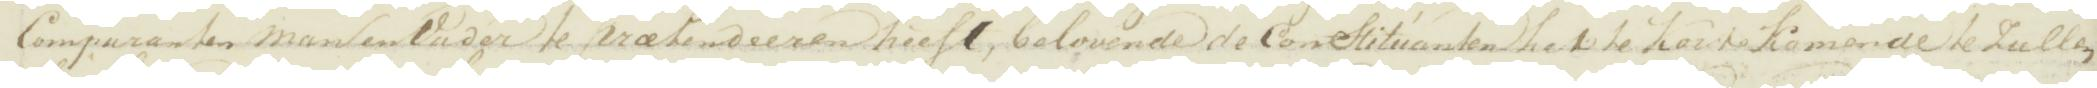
Comparanten man en Vader te Praetendeeren heeft, belovende de Constituanten het te korte komende te Zullen
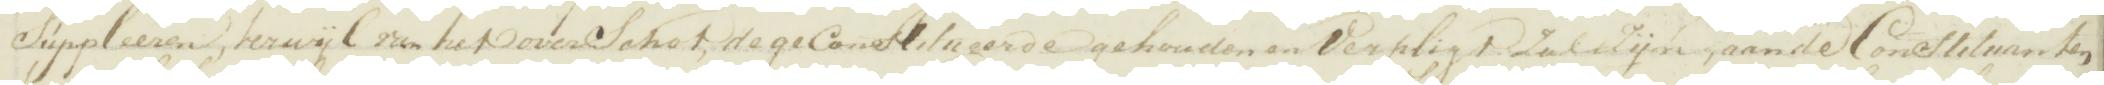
suppleeren, terwijl van het overschot de geConstitueerde gehouden en Verpligt zal Zijn, aan de Constituanten
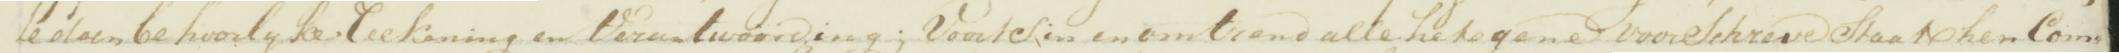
te doen behoorlijke Reekening en Verantwoording; Voorts in en omtrend alle hetgene voorschreve staat hen Com
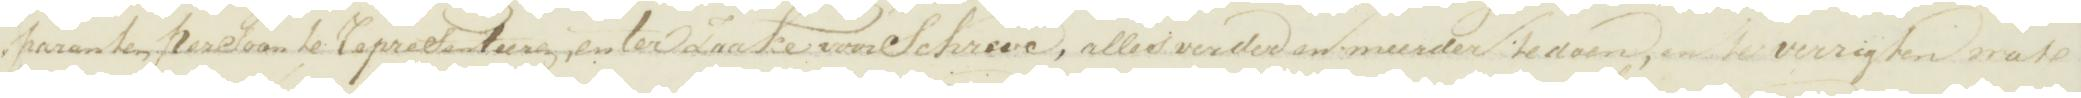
paranten persoon te Representeeren, en ter Zaake voorschreve, alles verder en meerder te doen, en te verrigten wat
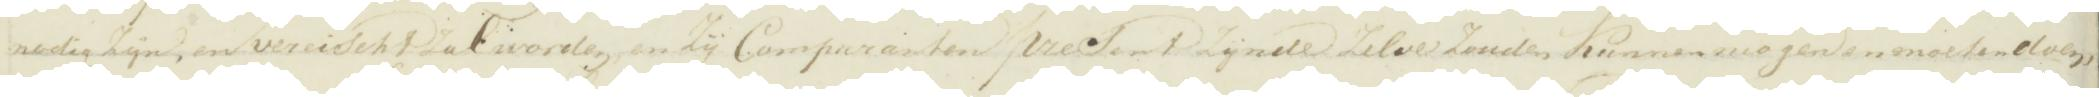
nodig Zijn, en vereischt Zal worden en Zij Comparanten present Zijnde zelve zouden Kunnen mogen en moeten doen
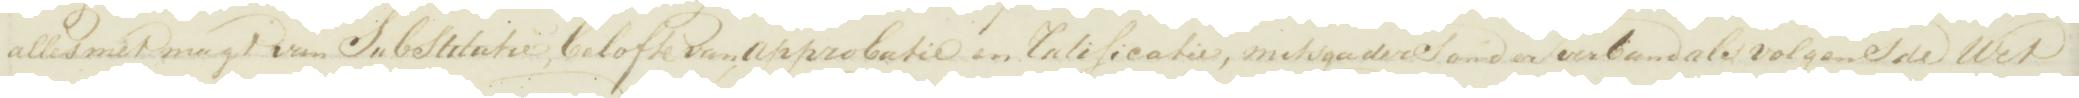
alles met magt van Substitutie, belofte van approbatie en Ratificatie, mitsgaders onder verband als volgens de Wet
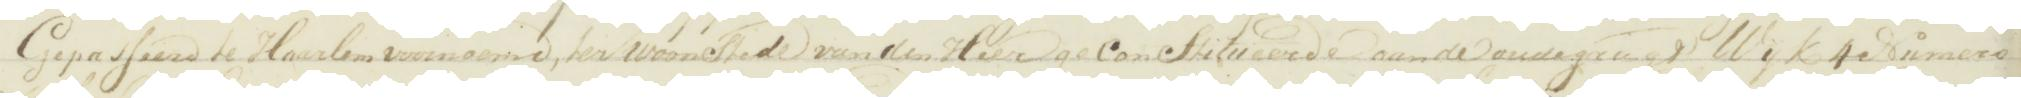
Gepasseerd te Haarlem voornoemd, ter woonstede van den Heer geconstitueerde aan de oudegragt Wijk 4 Numero
